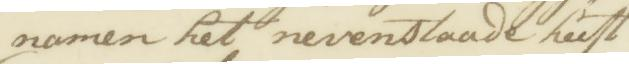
namen het nevenstaade heeft
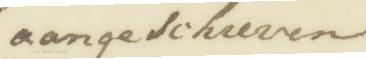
aangeschreven
